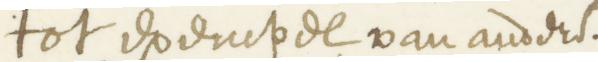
tot exempel van andere
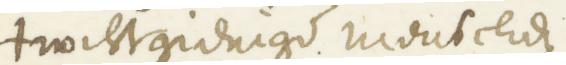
twistgierige menschen
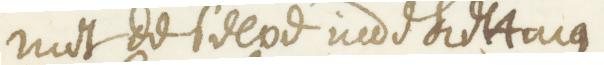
met deselve inde ketting
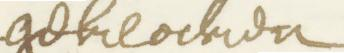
geklocken
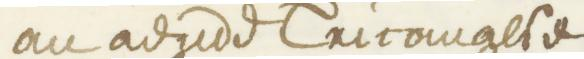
om aende Tricomalse
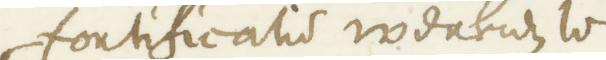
fortificatie werken te
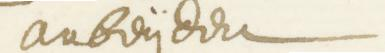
arbeijden
